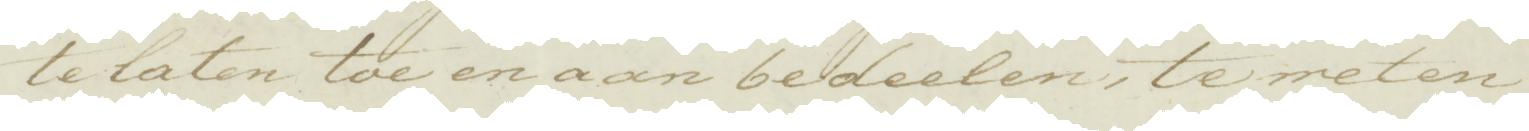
te laten toe en aan bedeelen, te weten
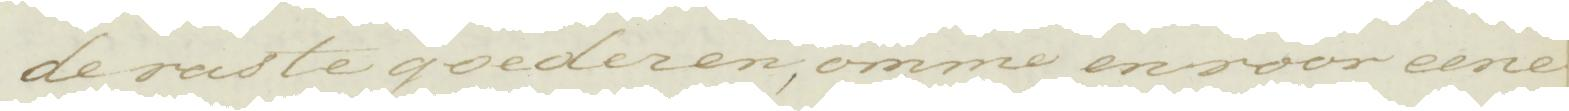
de vaste goederen, omme en voor eene
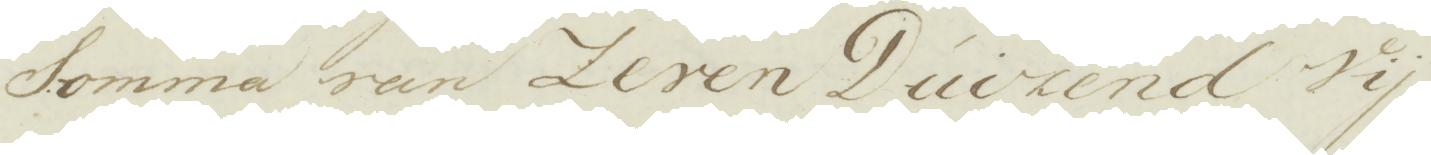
Somma van Zeven Duizend Vijf
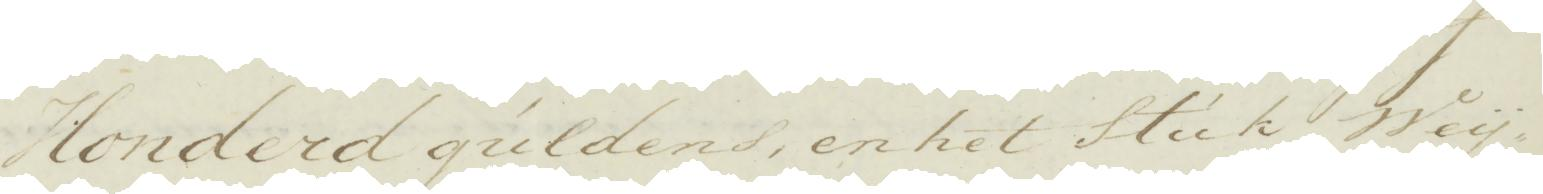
Honderd guldens, en het stuks Weij„
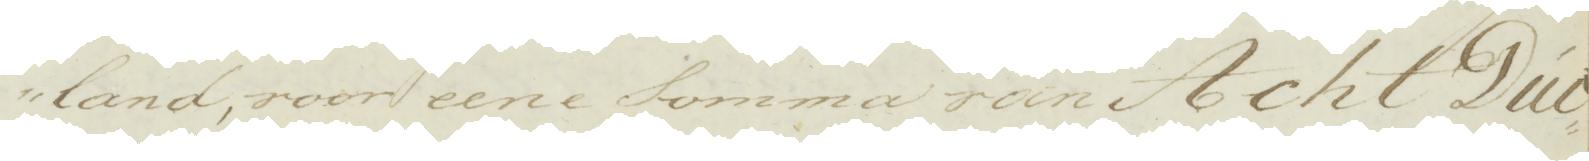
„land, voor eene Somma van Acht Dui„
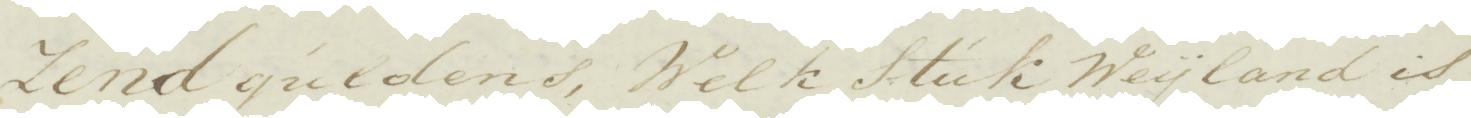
zend guldens, Welk stuk Weijland is
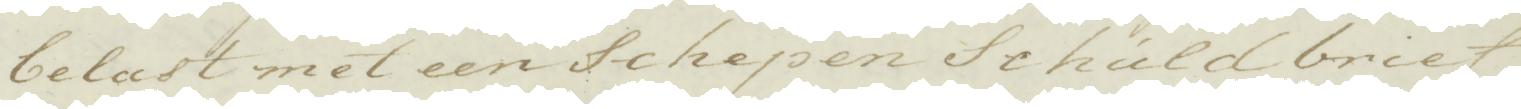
belast met een schepen schuld brief,
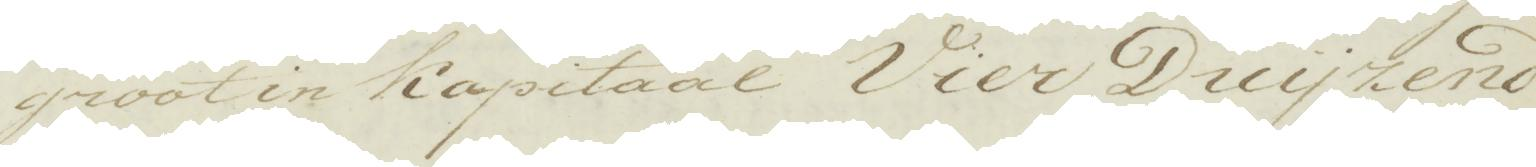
groot in Kapitaal Vier Duijzend
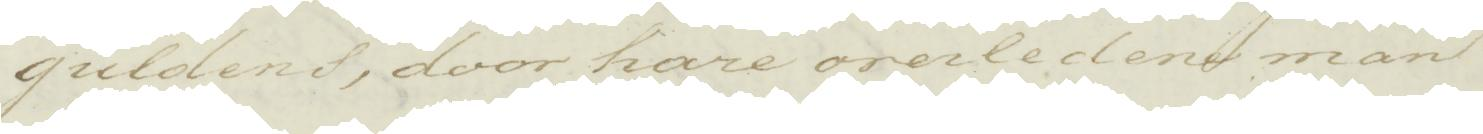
guldens, door hare overledene man
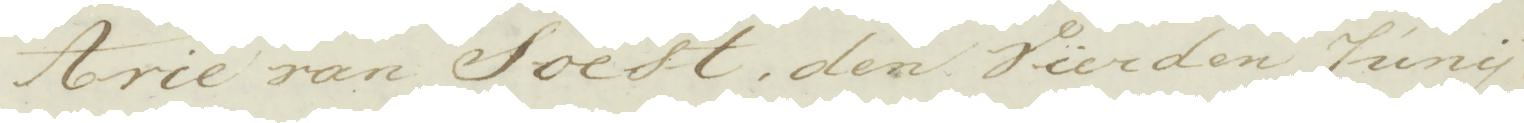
Arie van Soest, den Vierden Junij
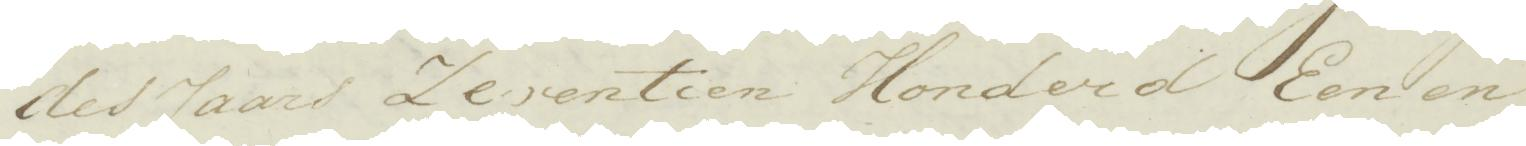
des Jaars Zeventien Honderd Een en
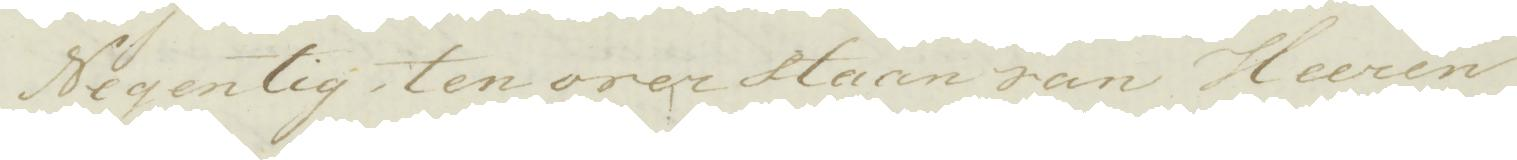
Negentig, ten over staan van Heeren
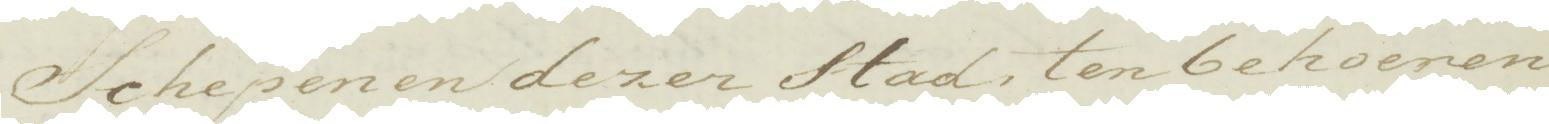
Schepenen dezer stad, ten behoeven
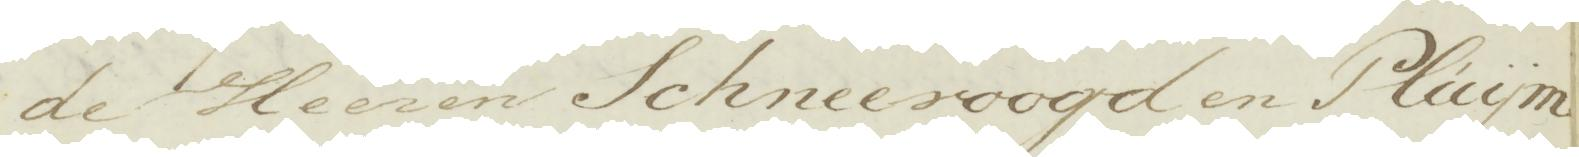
de Heeren Schneevoogd en Pluijm
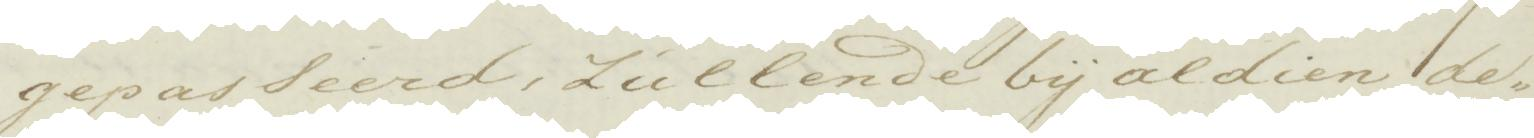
gepasseerd, zullende bij aldien de„
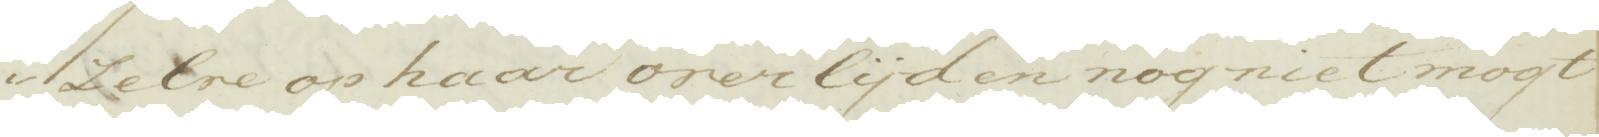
„zelve op haar overlijden nog niet mogt
